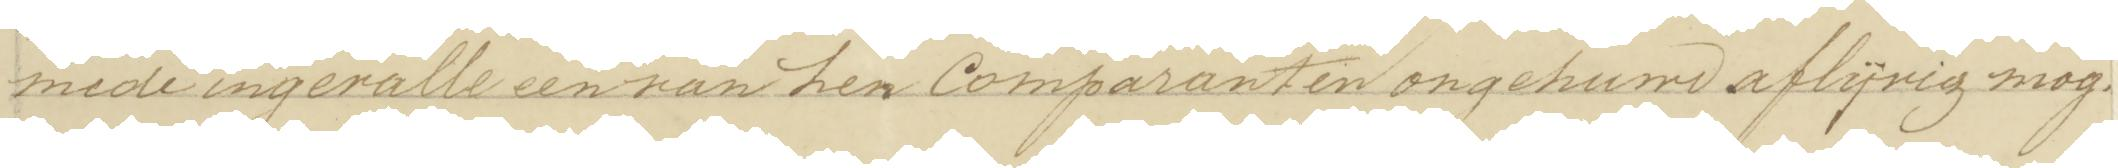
mede ingevalle een van hen Comparanten ongehuwd aflijvig mog,
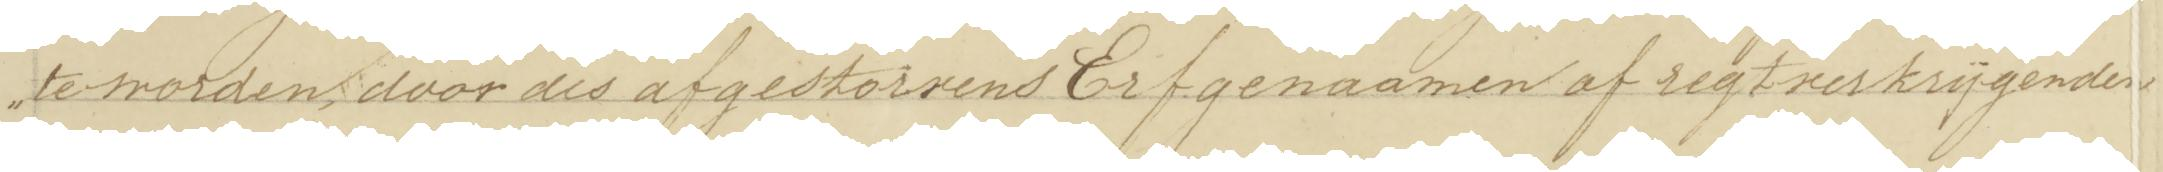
„te worden, door des afgestorvens Erfgenaamen of regtverkrijgenden
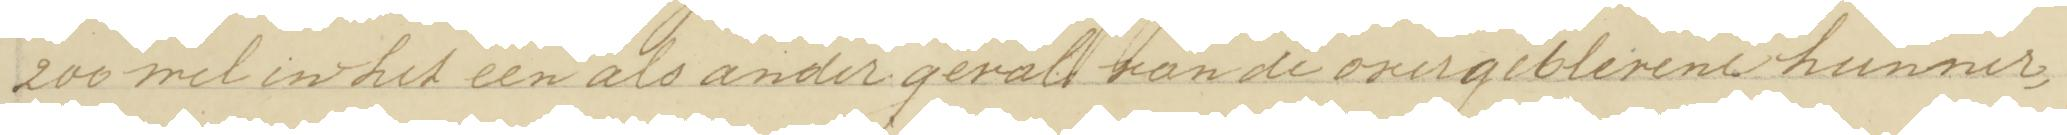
zoo wel in het een als ander geval van de overgeblevene hunner,
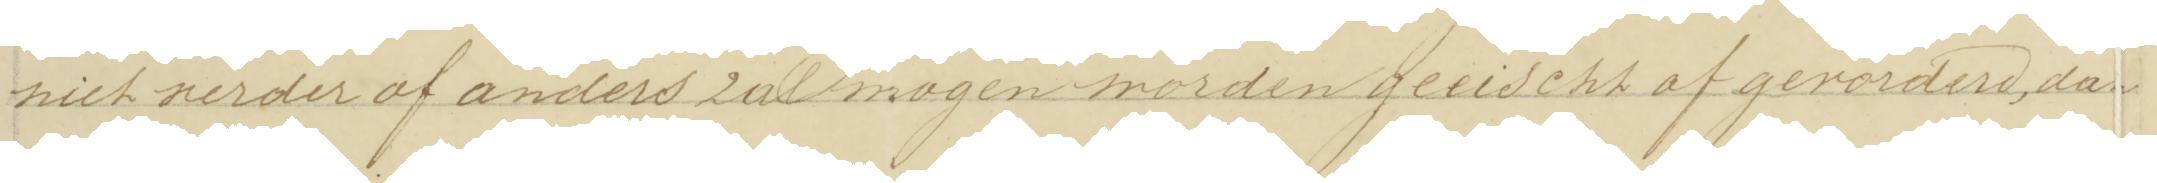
niet verder of anders zal mogen worden geeischt of gevorderd, dan
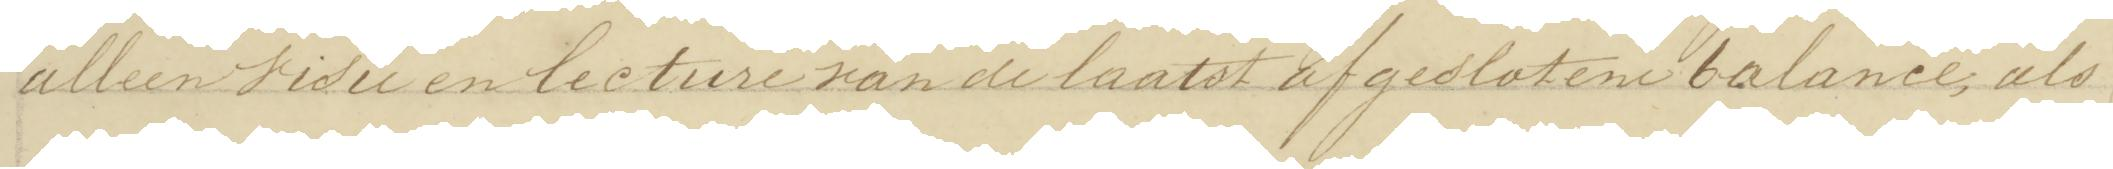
alleen visie en lecture van de laatst afgesloten balance, als
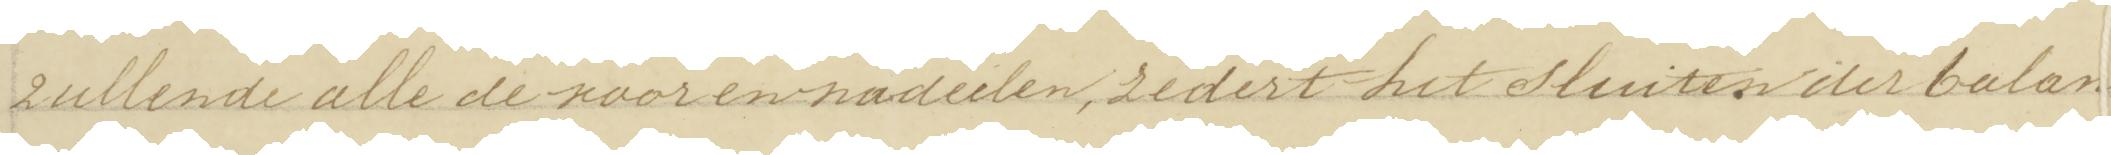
zullende alle de voor en nadeelen, zedert het sluiten der bala
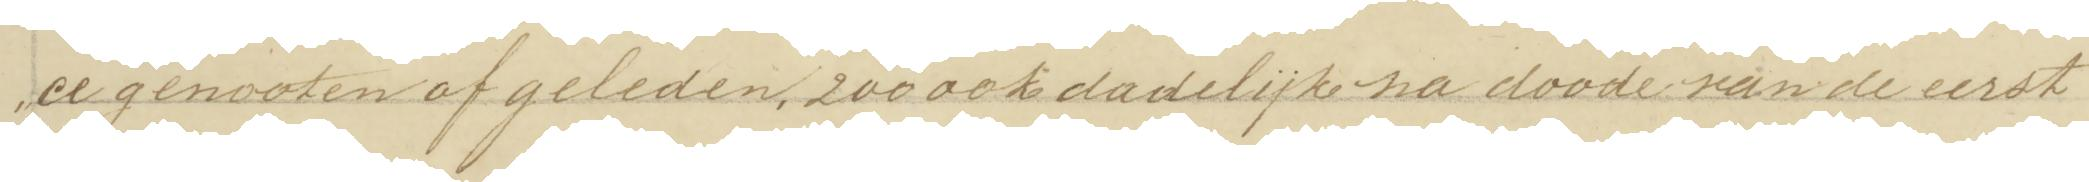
„ce genooten of geleden, zoo ook dadelijk na doode van de eerst
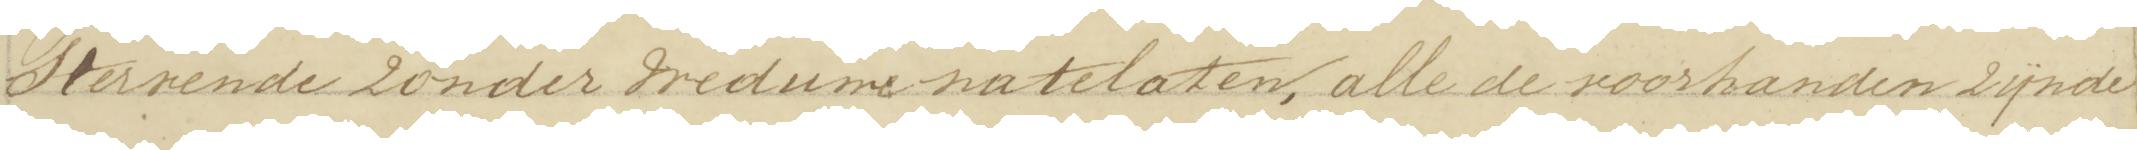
stervende zonder weduwe natelaten, alle de voorhanden zijnde
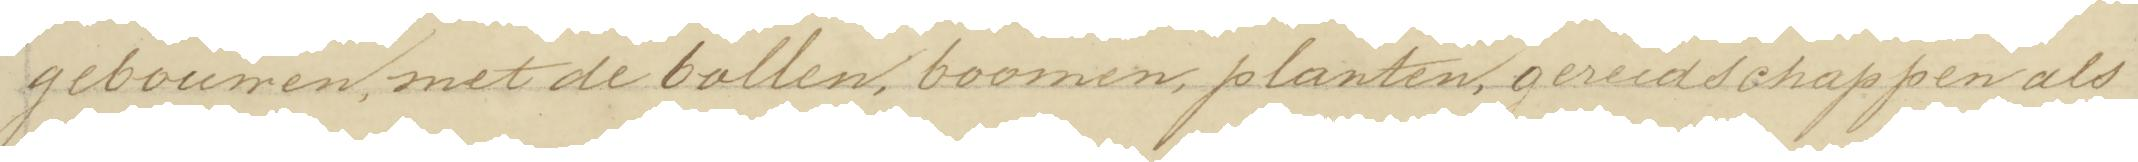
gebouwen, met de bollen, boomen, planten gereedschappen als
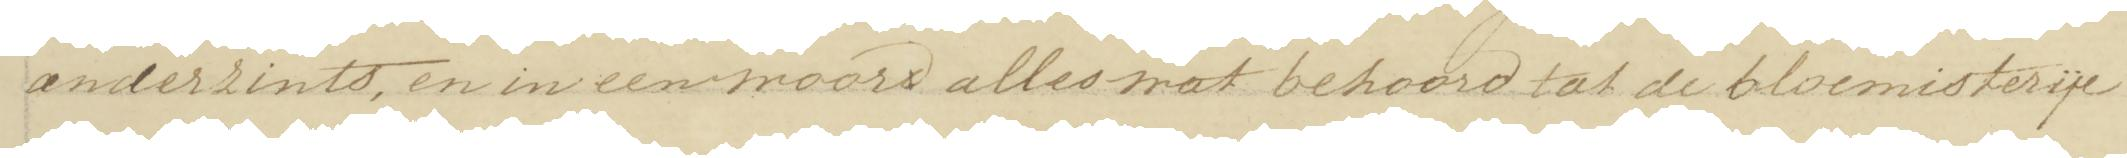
anderzints, en in een woord alles wat behoord tot de bloemisterije
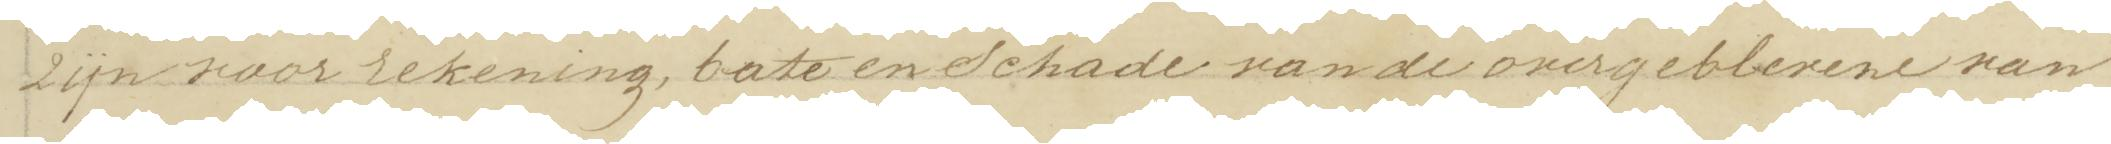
zijn voor rekening, bate en schade van de overgeblevene van
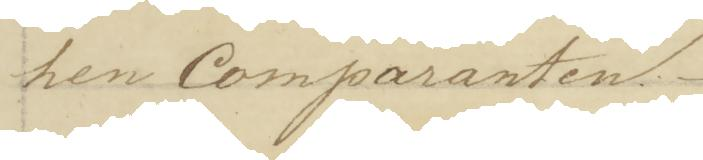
hen Comparanten.
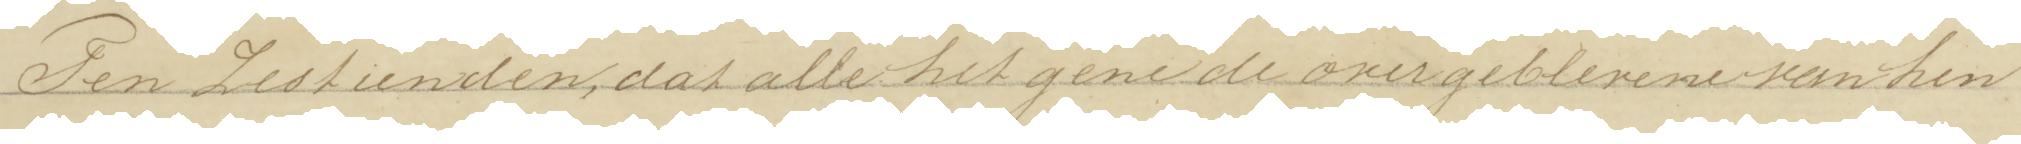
Ten Zestienden, dat alle het gene de overgeblevene van hen
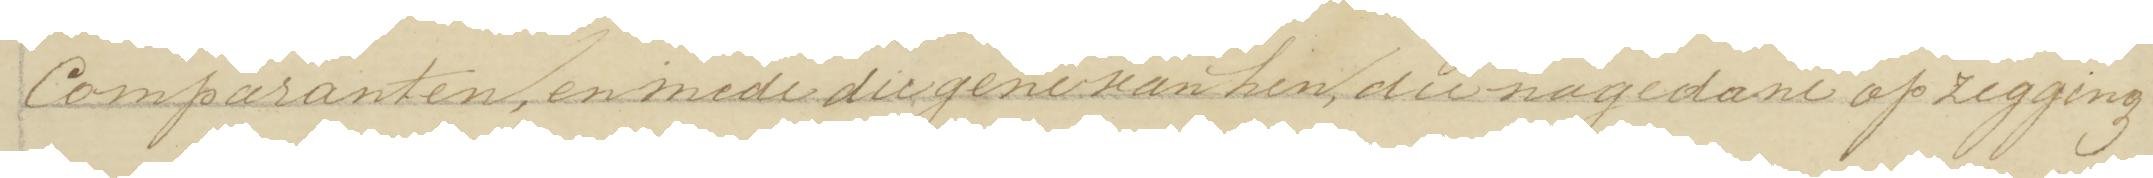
Comparanten, en mede die gene van hen, die nagedane op zegging
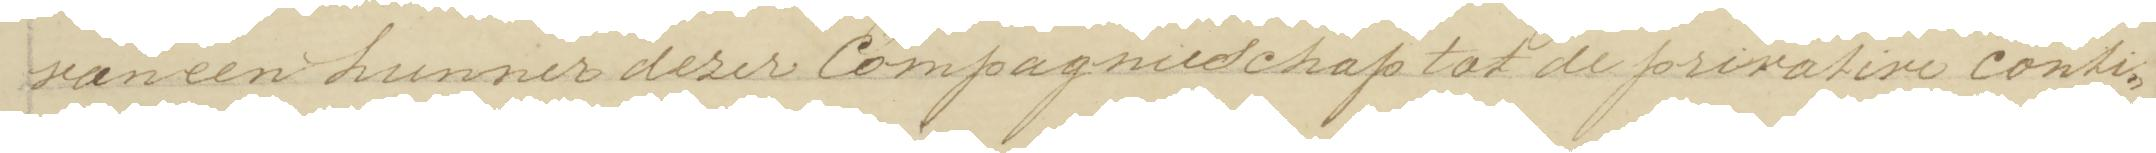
van een hunner dezer Compagnieschap tot de privative conti„
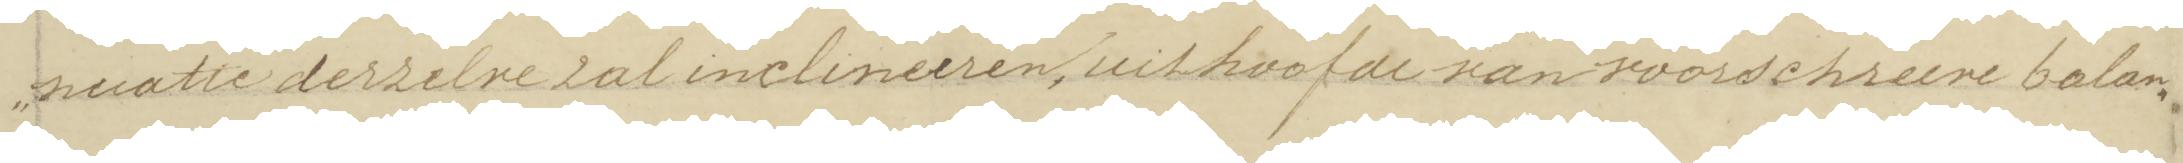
„nuatie derzelve zal inclineeren, uit hoofde van voorschreeve balan„
